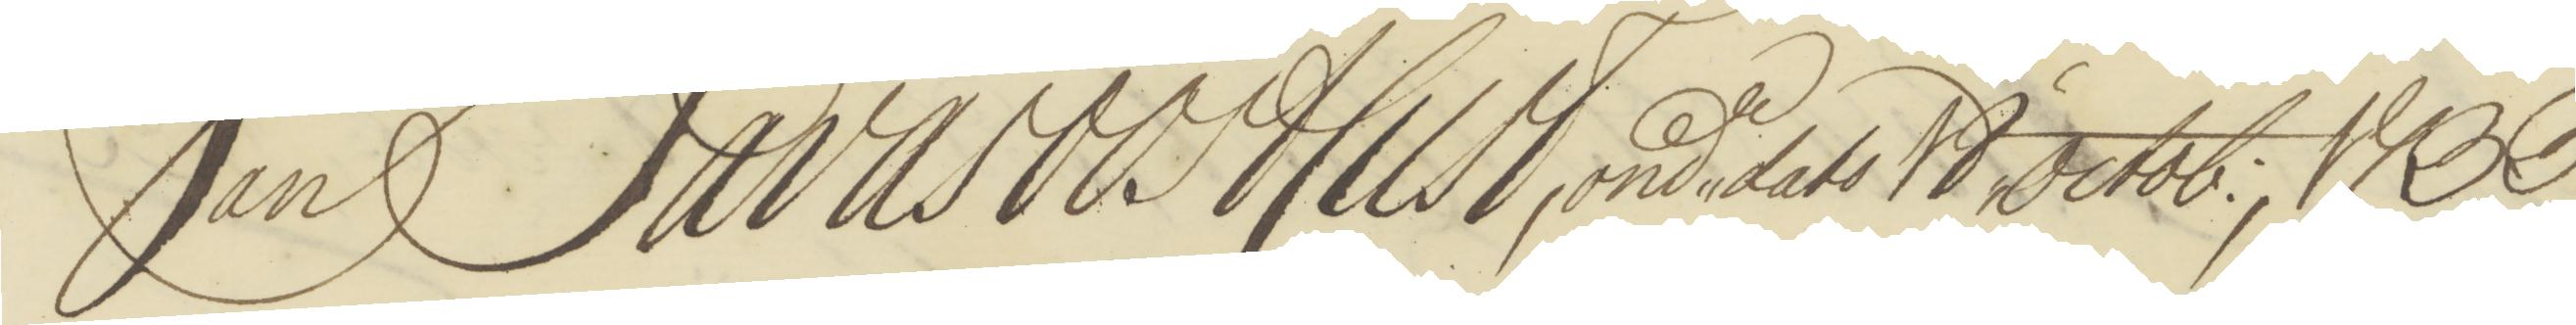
Van Javasoostcust, ond„r dato 18„' octob:, 1733
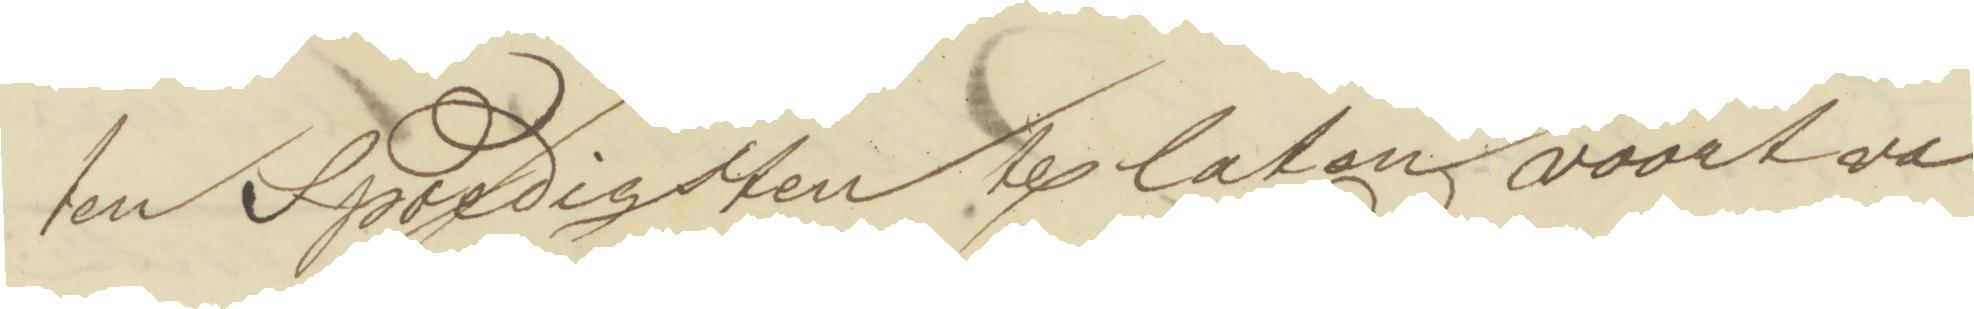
ten spoedigsten te laten voort va
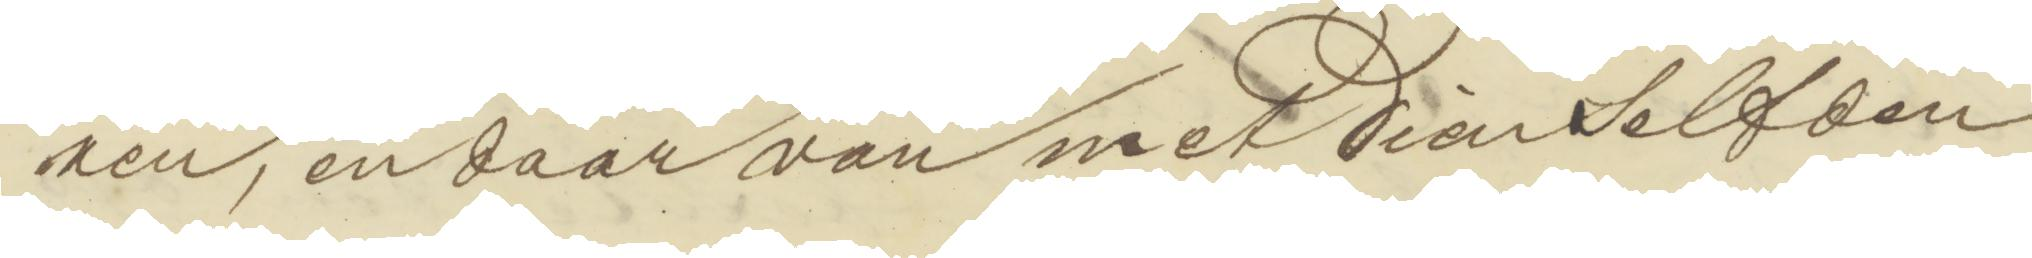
ren, en daar van met dienselfden
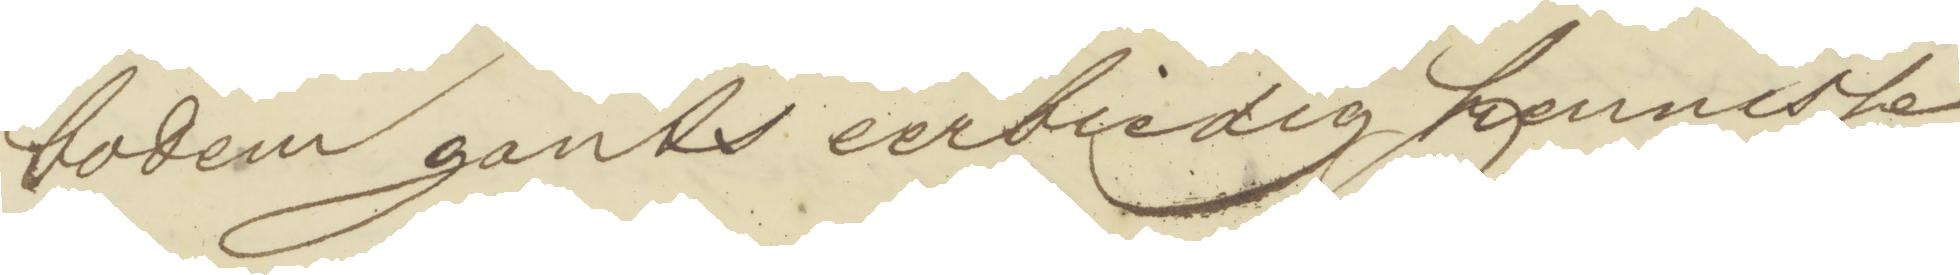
bodem gants eerbiedig kennisse
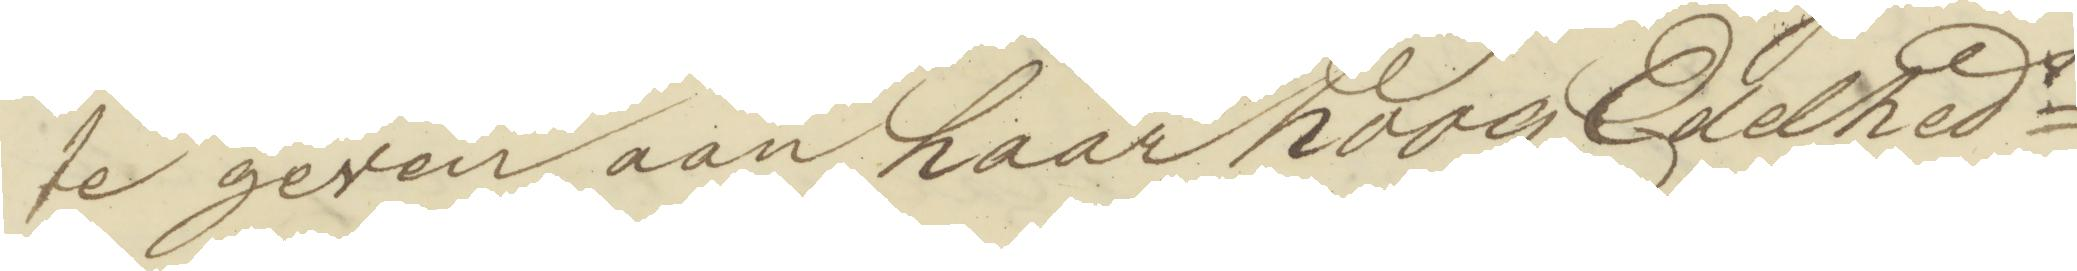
te geven aan haar hoog Edelhed=t
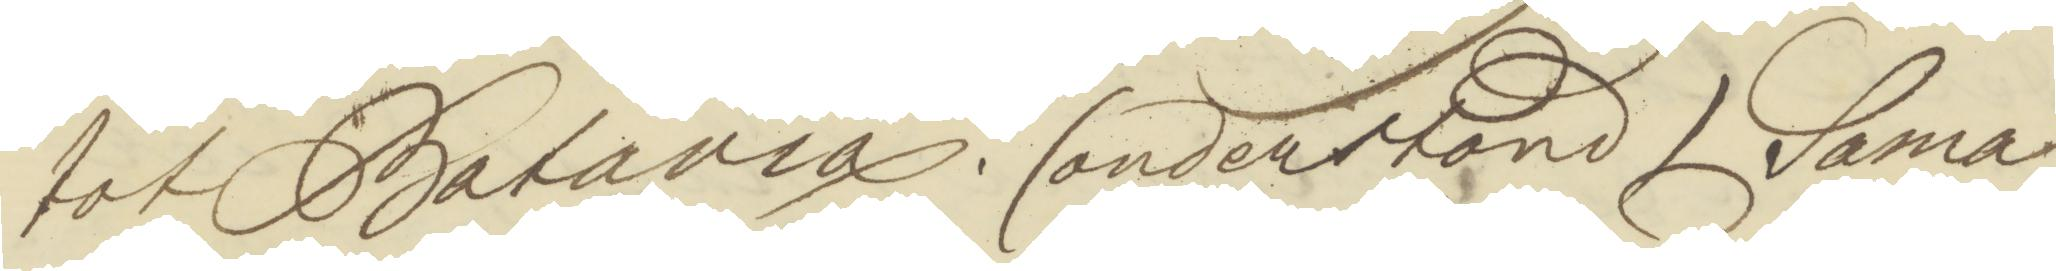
tot Batavia. (onderstond) sama
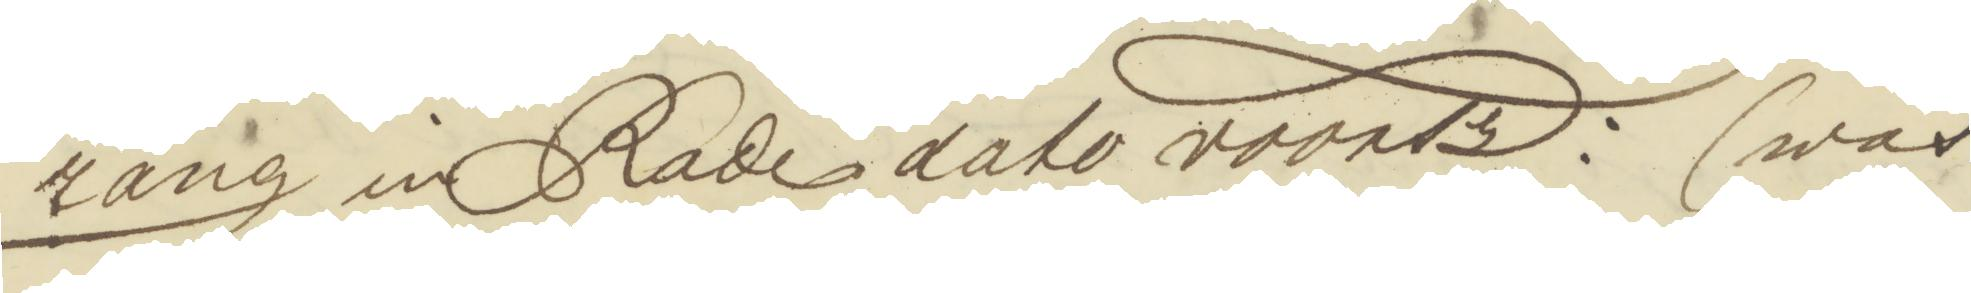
rang in Rade dato voorsz: (was
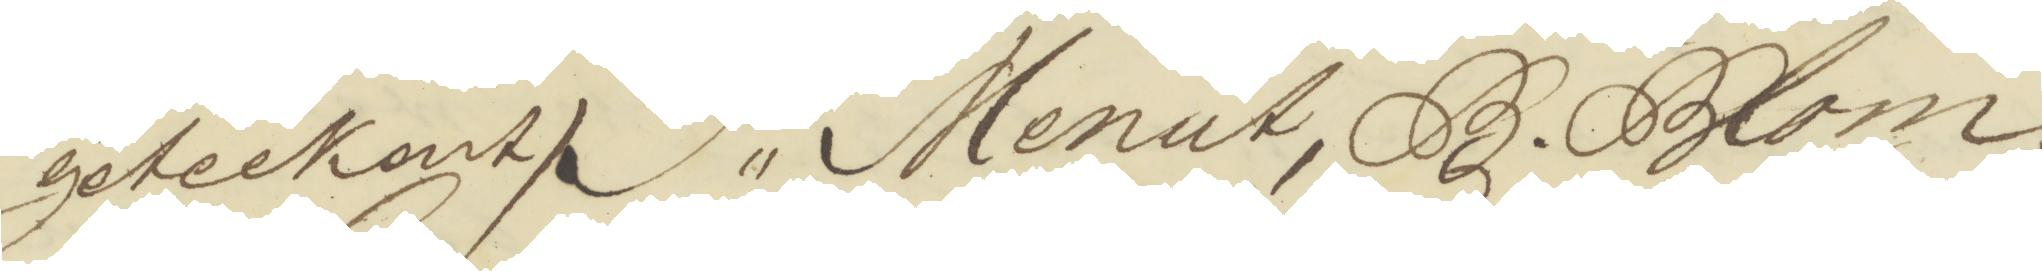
geteekent) J„n Menut, B. Blom,
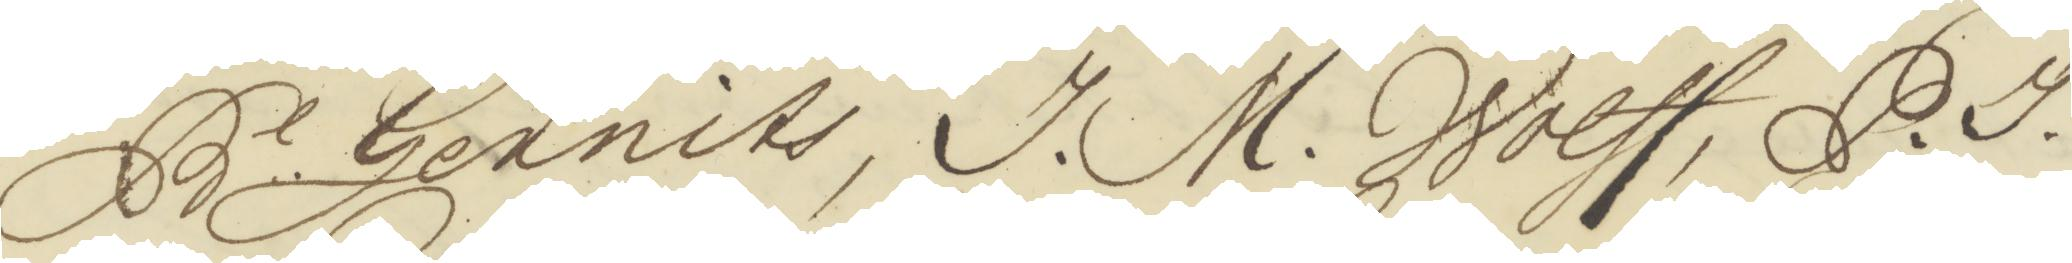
B:l Gernits, I. M. Wolff, P. I.
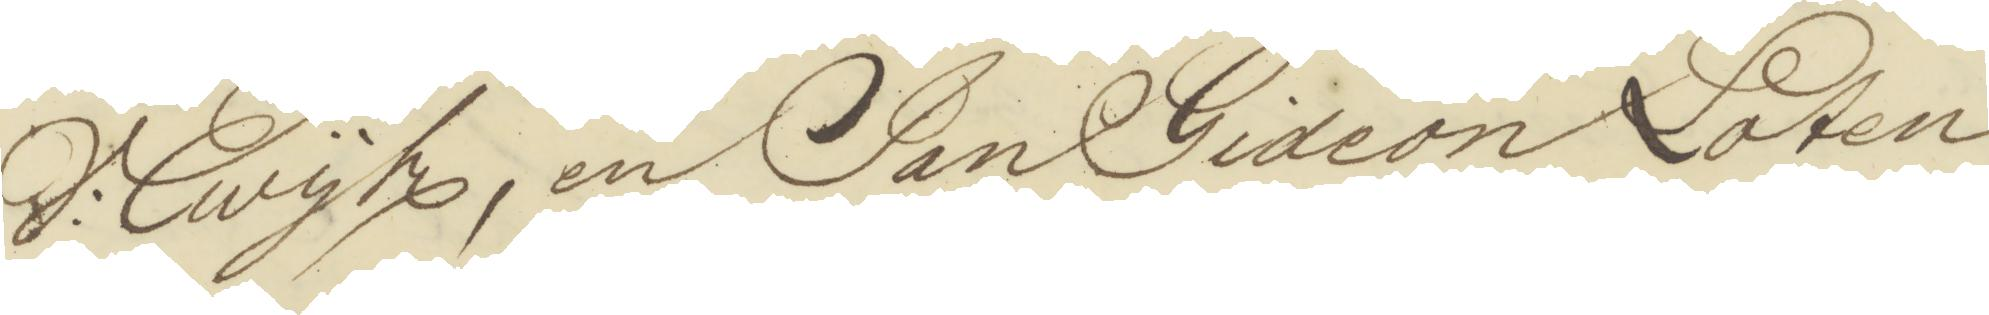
V: Ewijk, en Ian Gideon Loten
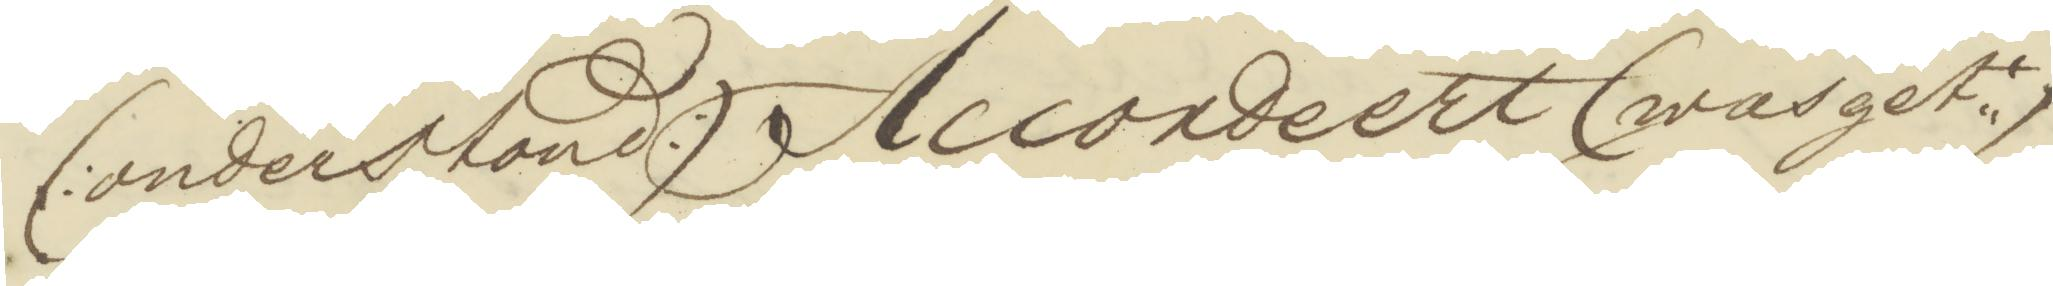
(:onderstond:) Accordeert (was get„t)
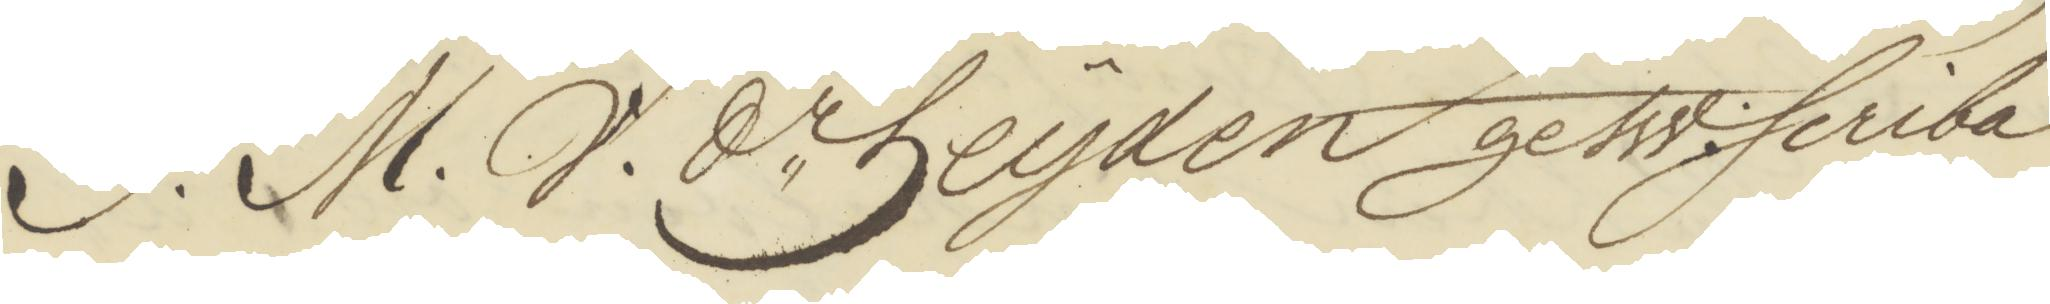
S. M. V. d„r heijden gesw: scriba
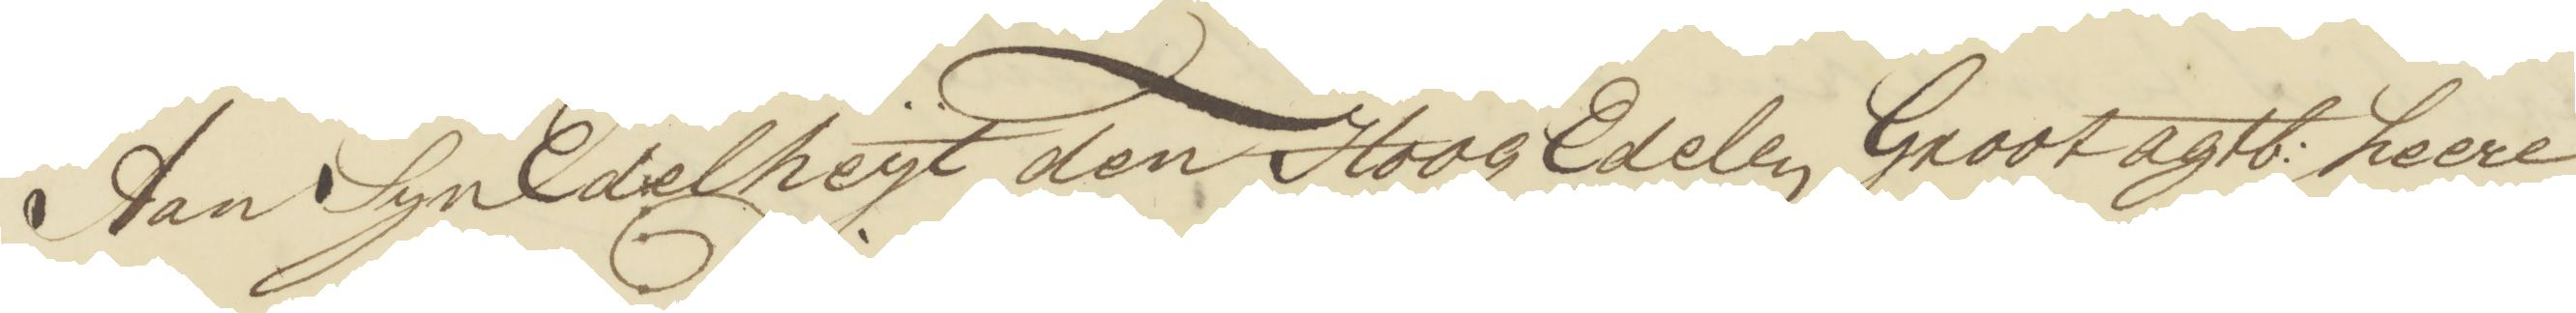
Aan sijn Edelheijt den Hoog Edelen Groot agtb: heere
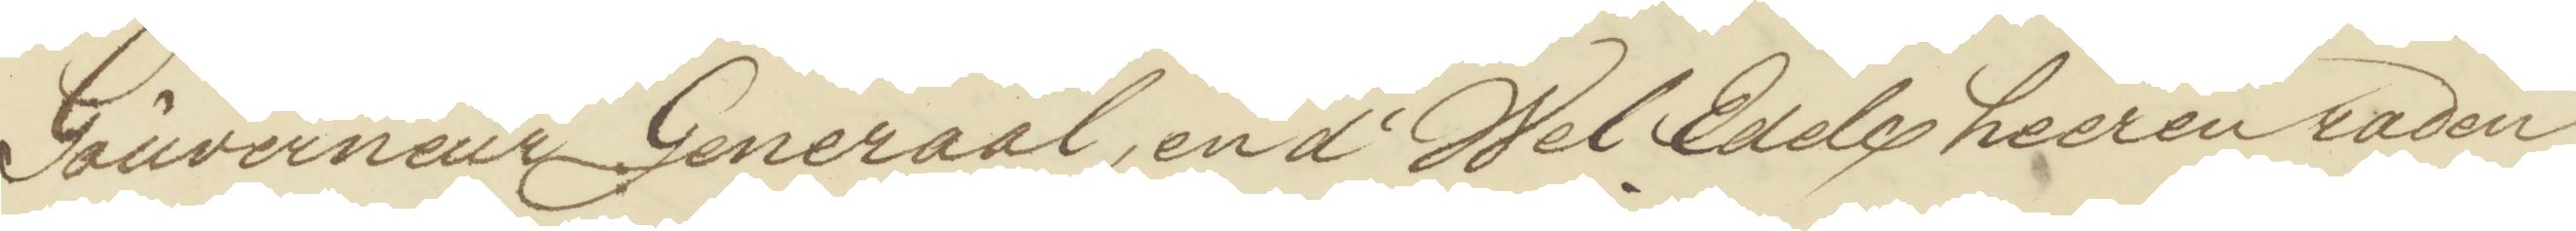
Gouverneur Generaal, en d' Wel Edele heeren raden
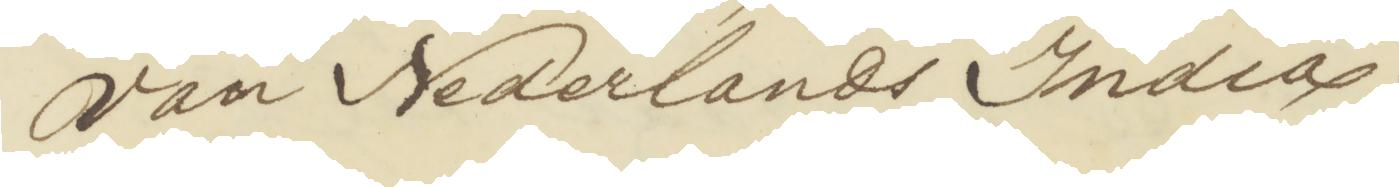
van Nederlands India.
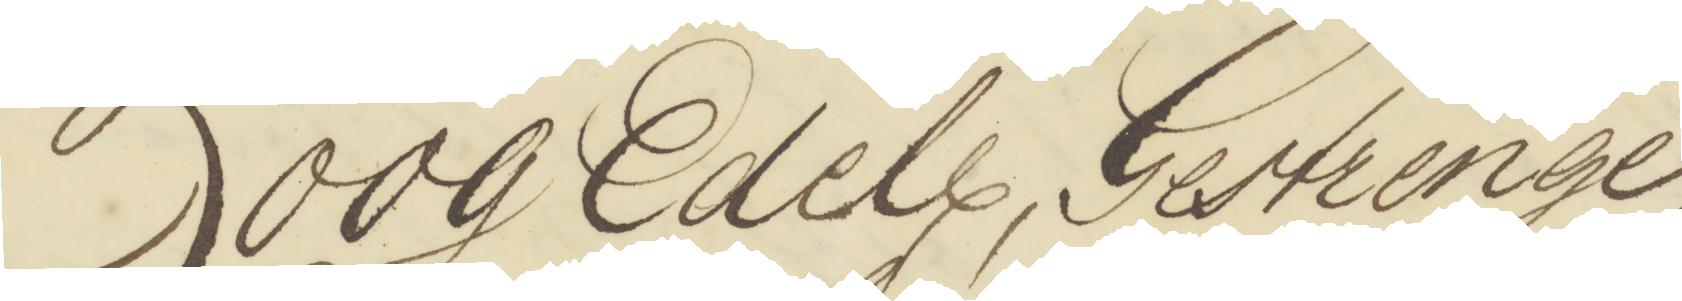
Hoog Edele, Gestrenge
